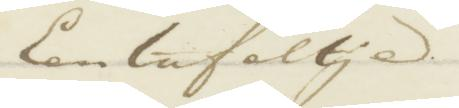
Een tafeltje
